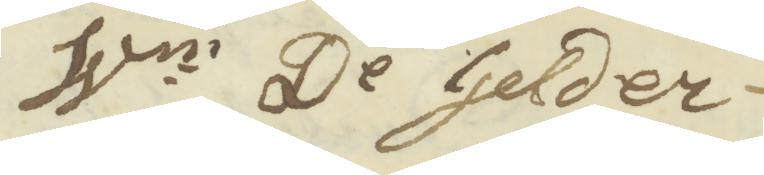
W:m De Gelder
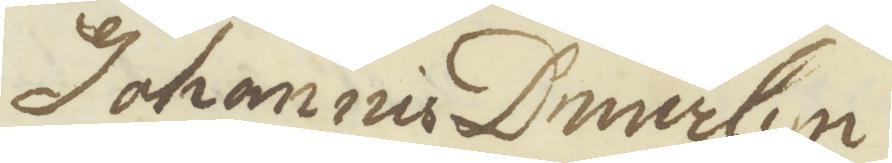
Johannis Duurlyn
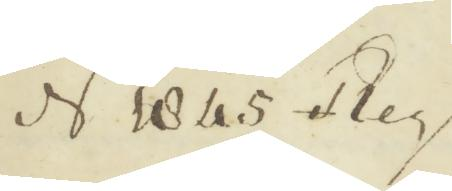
N 1845 Reg
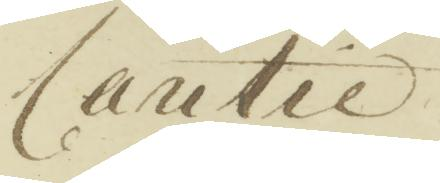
Cautie
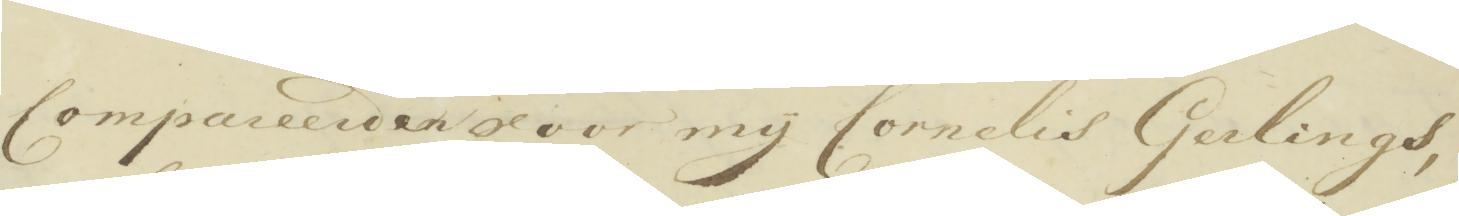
Compareerden voor mij Cornelis Gerlings,
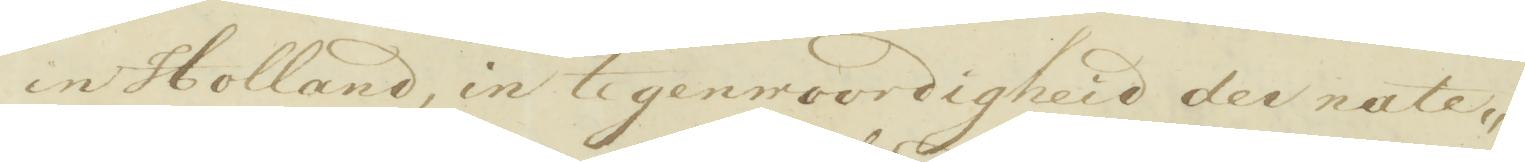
in Holland, in tegenwoordigheid der nate„
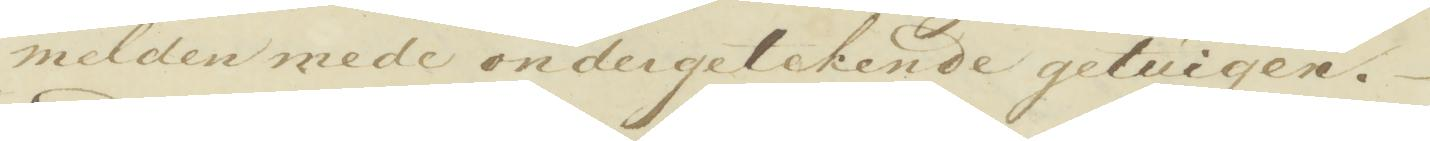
melden mede ondergetekende getuigen.-
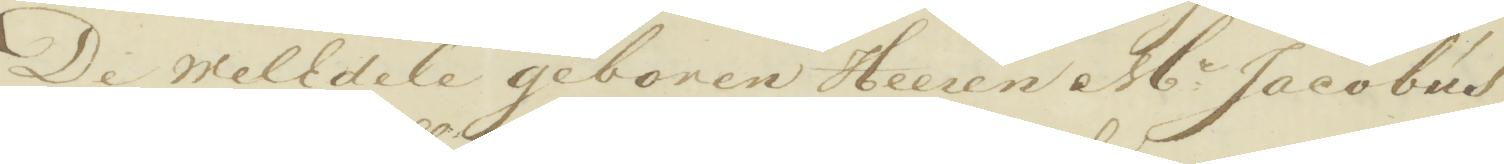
De welEdele geboren Heeren M:r Jacobus
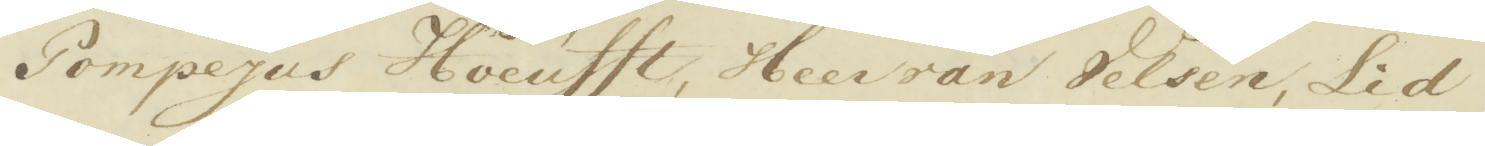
Pompejus Hoeufft, Heer van Velsen, Lid
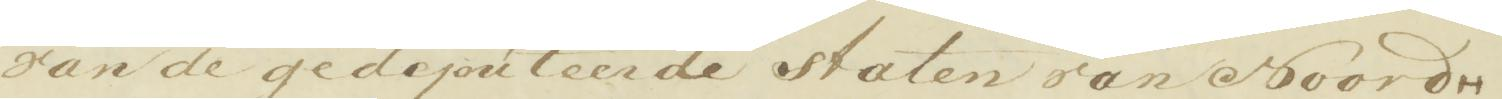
van de gedeputeerde staten van Noord
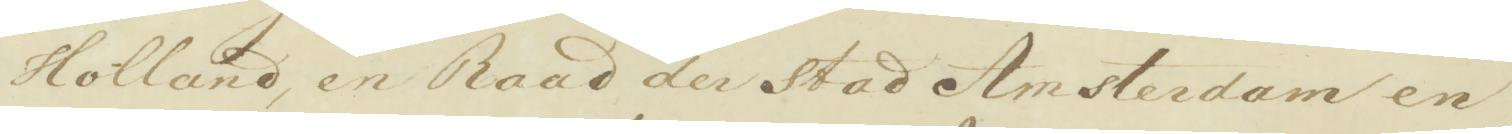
Holland, en Raad der stad Amsterdam en
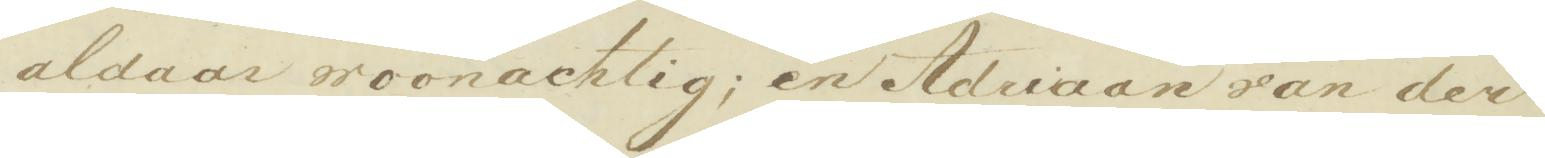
aldaar woonachtig; en Adriaan van der
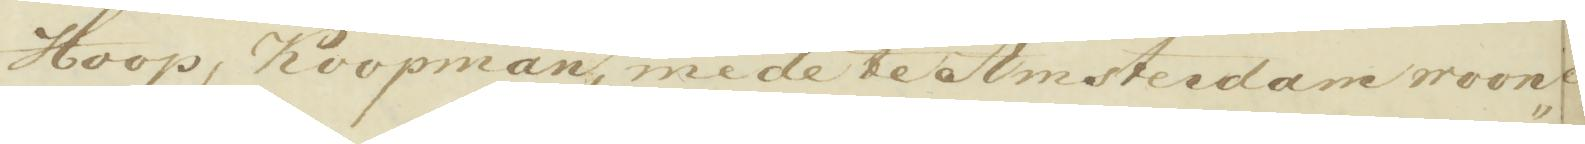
Hoop, Koopman, mede te Amsterdam woon„
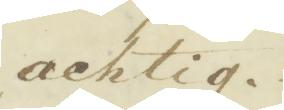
achtig.
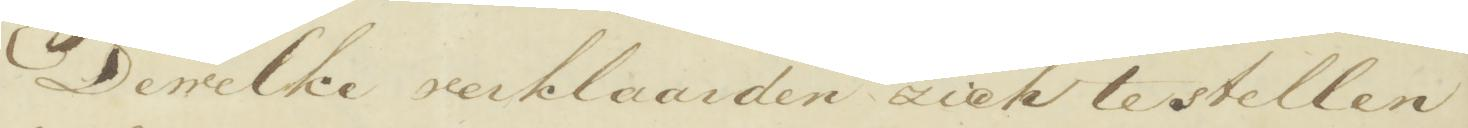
Dewelke verklaarden zich te stellen
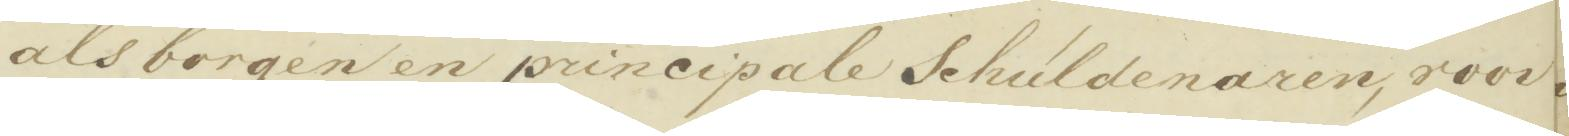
als borgen en principale schuldenaren, voor
